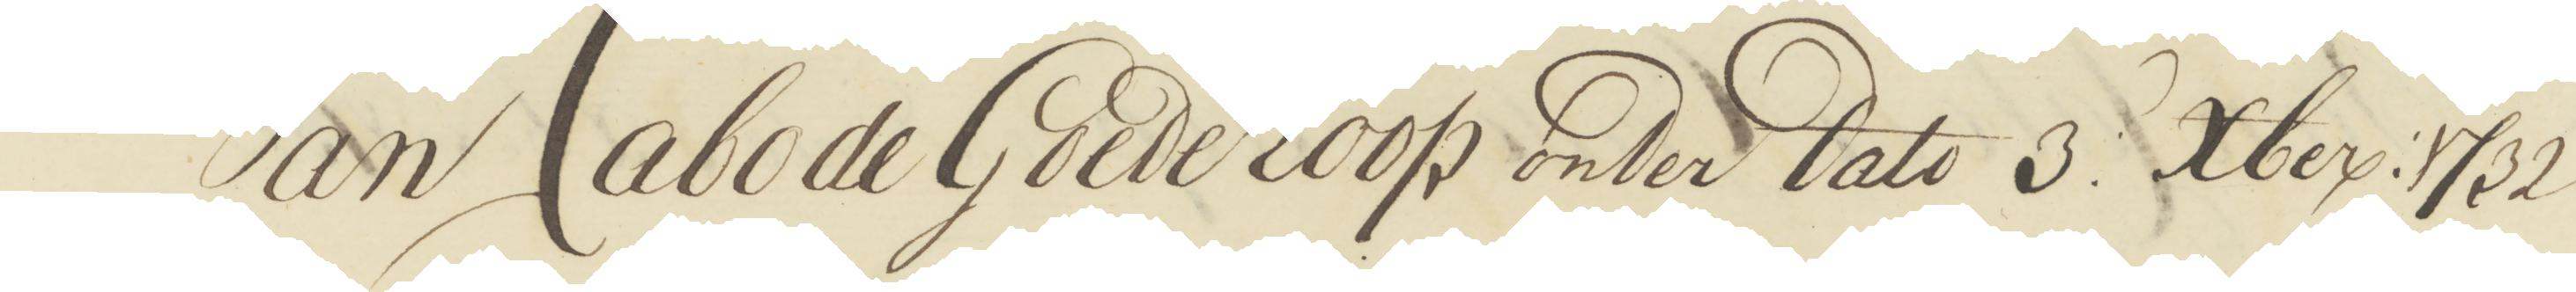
Van Cabo de Goede hoop onder dato 3:' xber: 1732
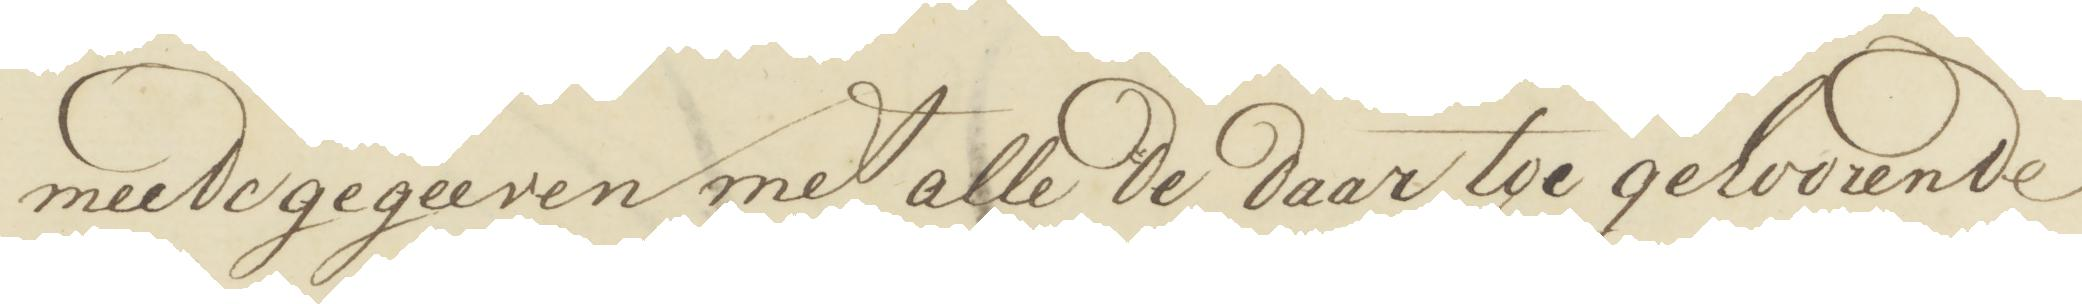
meede gegeeven met alle de daar toe gehoorende
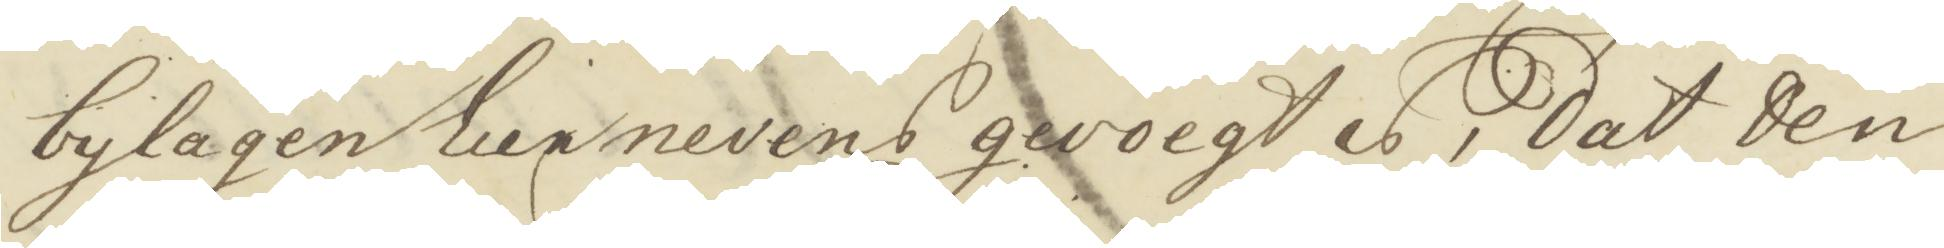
bijlagen hier nevens gevoegt is, dat den
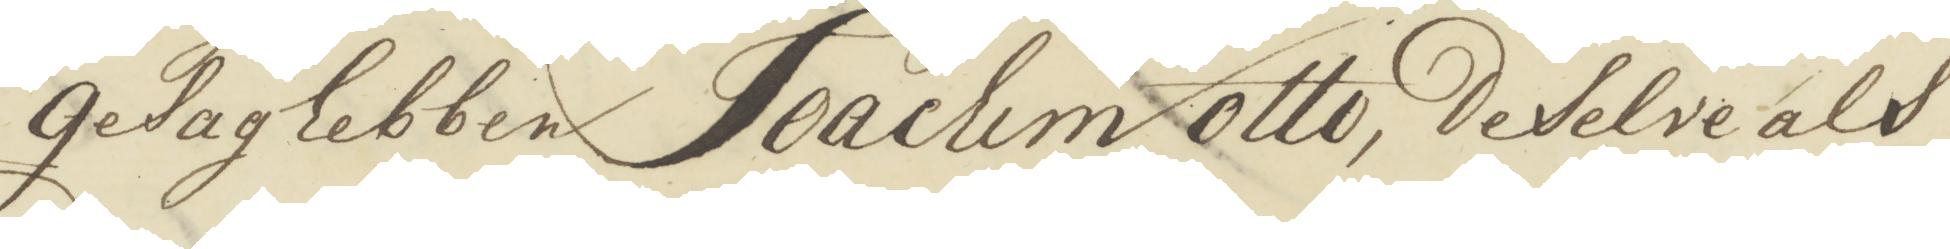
gesaghebber Ioachim otto, deselve als
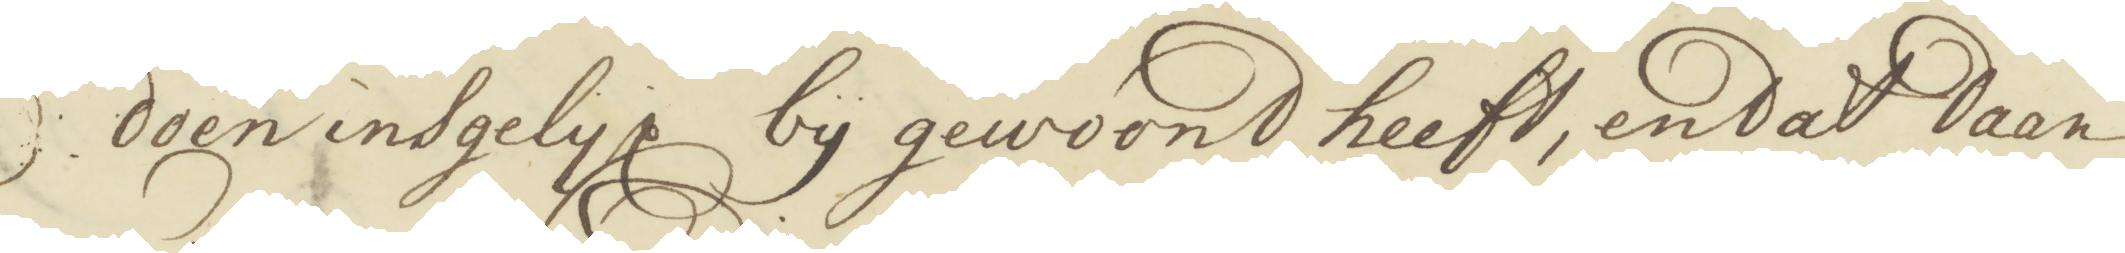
doen insgelijx bij gewoond heeft, en dat daar
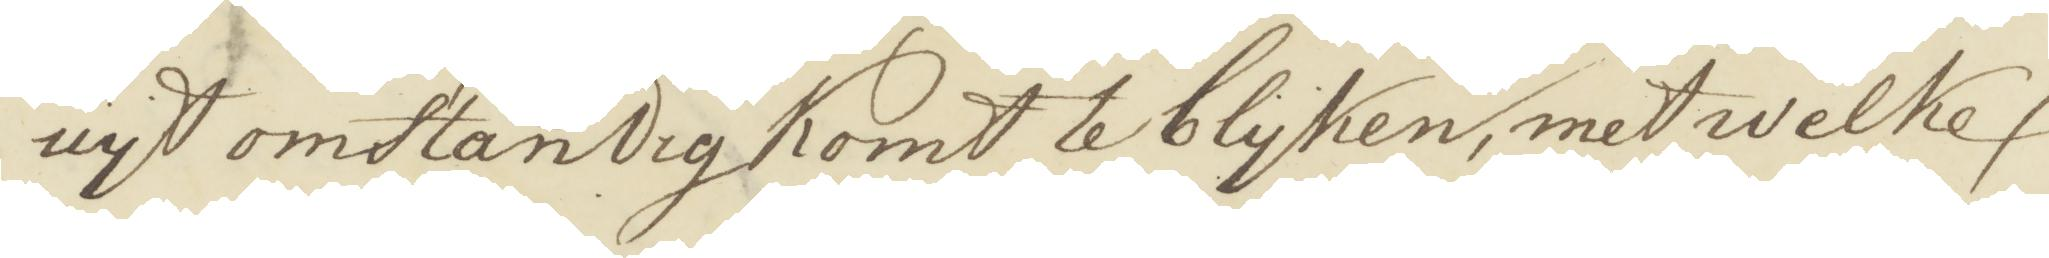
uijt omstandig komt te blijken, met welke
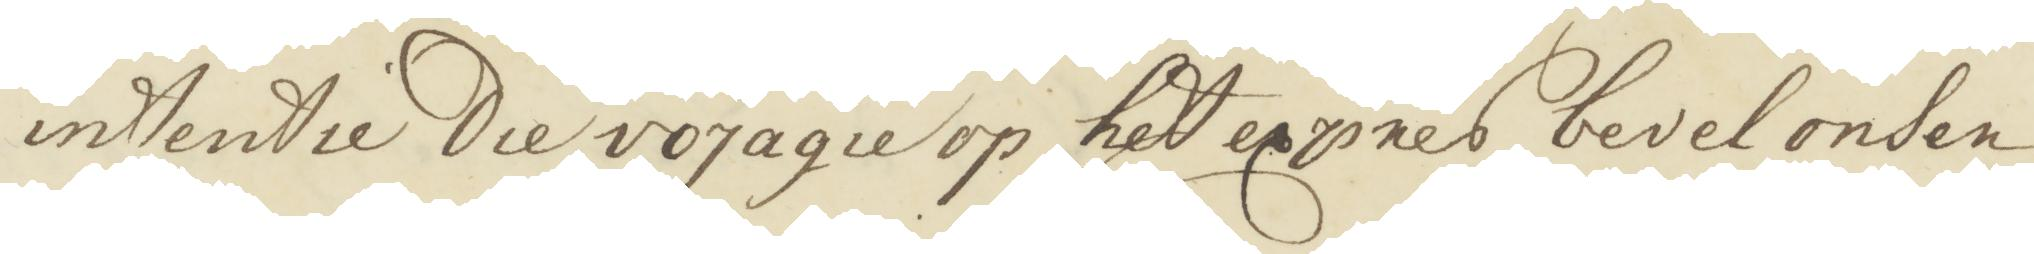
intentie die vojagie op het expres bevel onsen
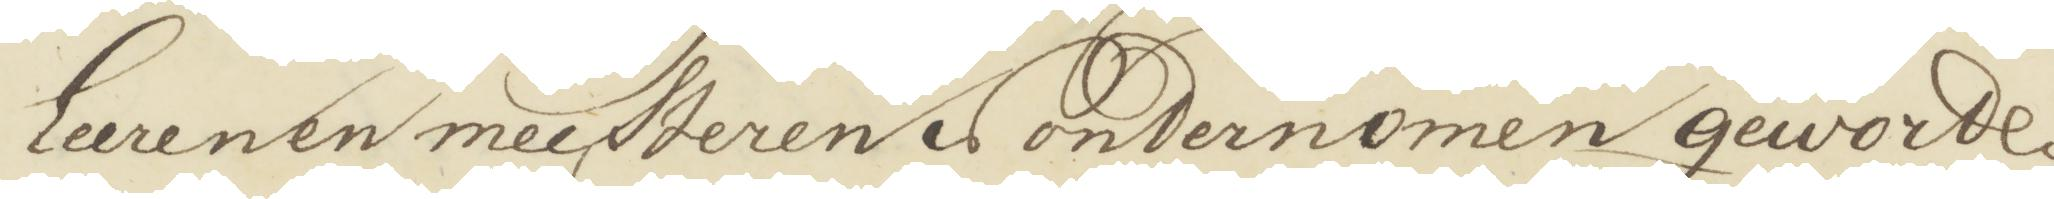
heeren en meesteren is ondernomen geworden
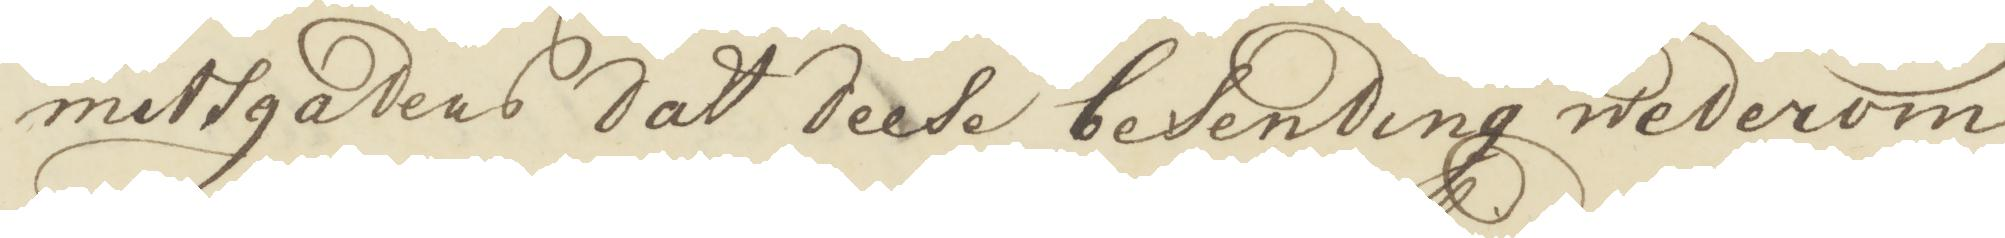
mitsgaders dat deese besending wederom
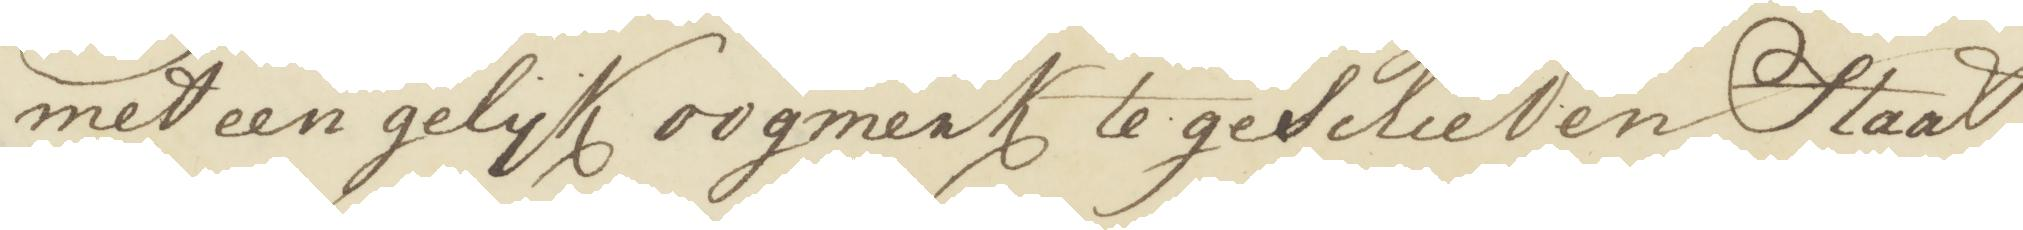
met een gelijk oogmerk te geschieden staat
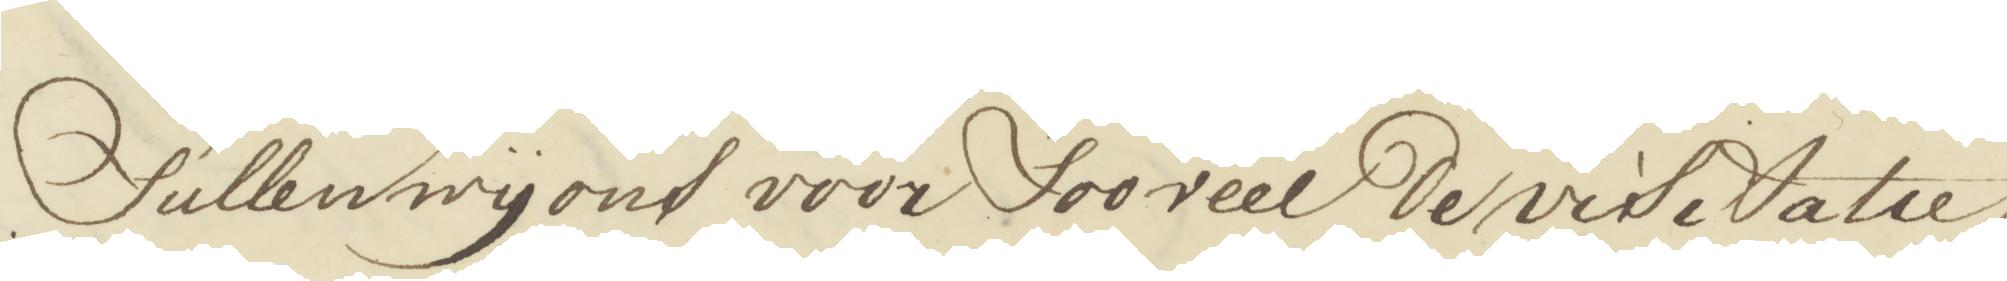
sullen wij ons voor soo veel de visitatie
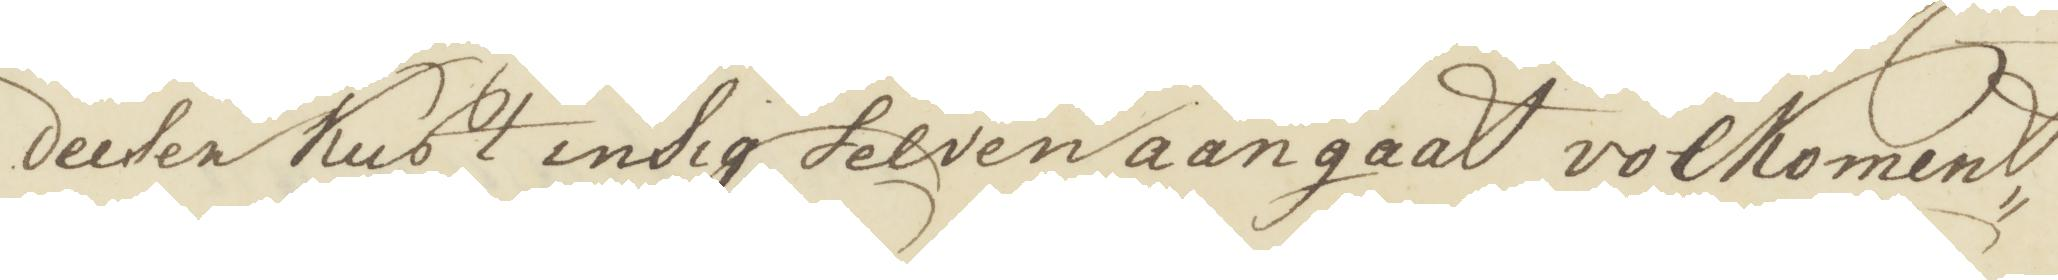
deeser kust insig selven aangaat volkoment„
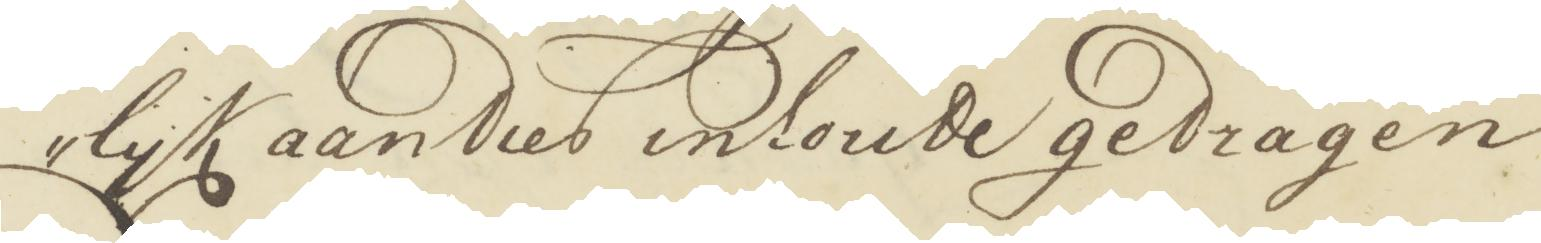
„lijk aan dies inhoude gedragen
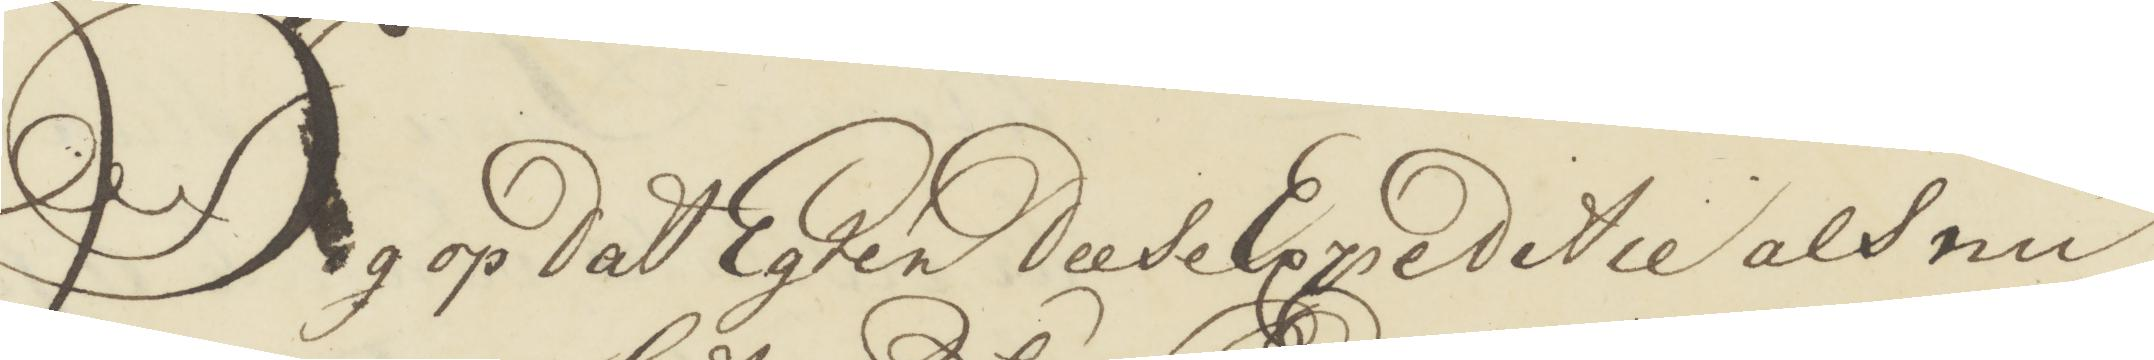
Dog op dat Egter deese Expeditie als nu
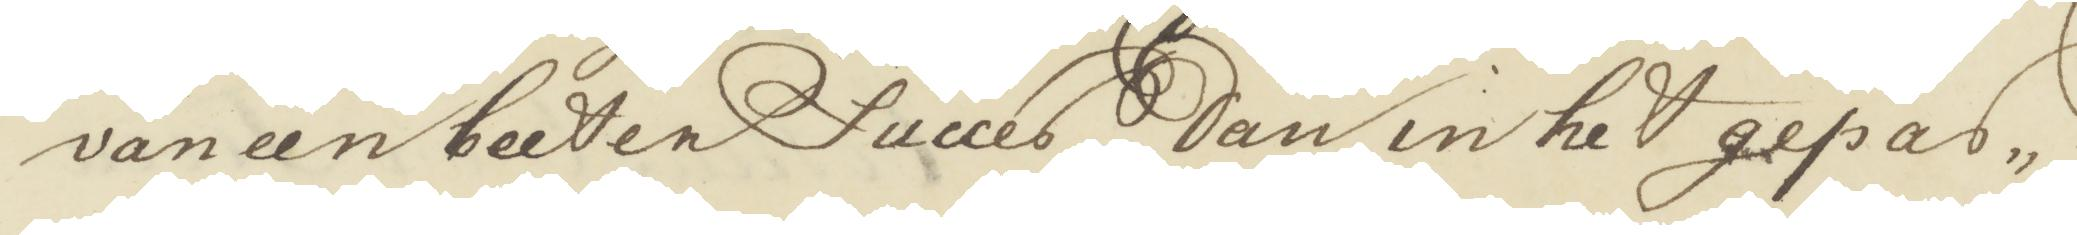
van een beeter succes dan in het gepas„
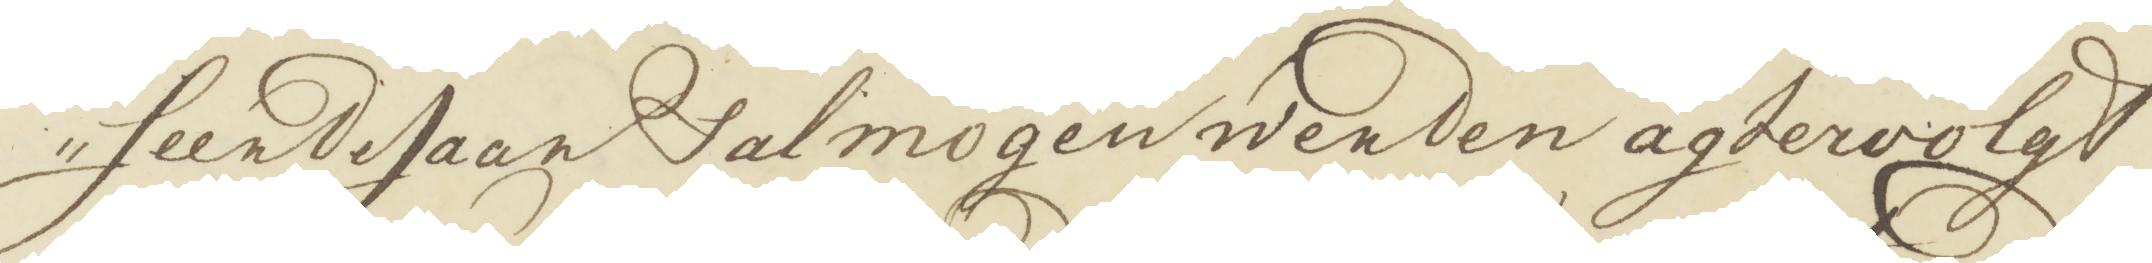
„seerde jaar sal mogen werden agtervolgt,
